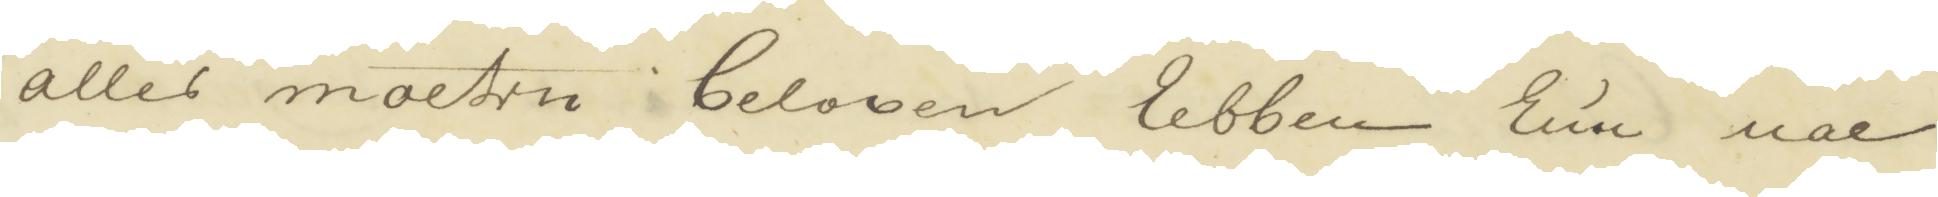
alles moeten beloven hebben hun nae
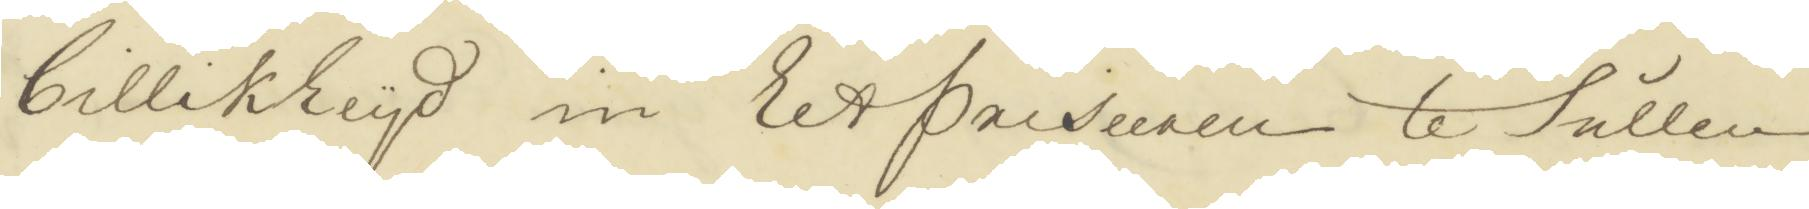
billikheijd in het priseeren te sullen
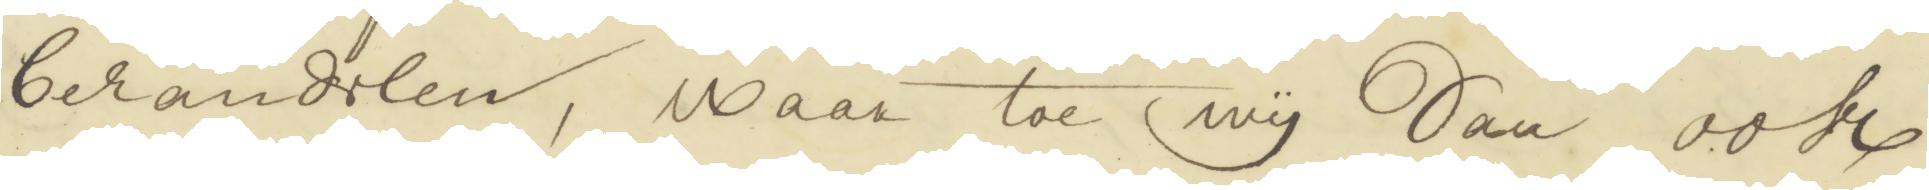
behandelen, waar toe wij dan ook
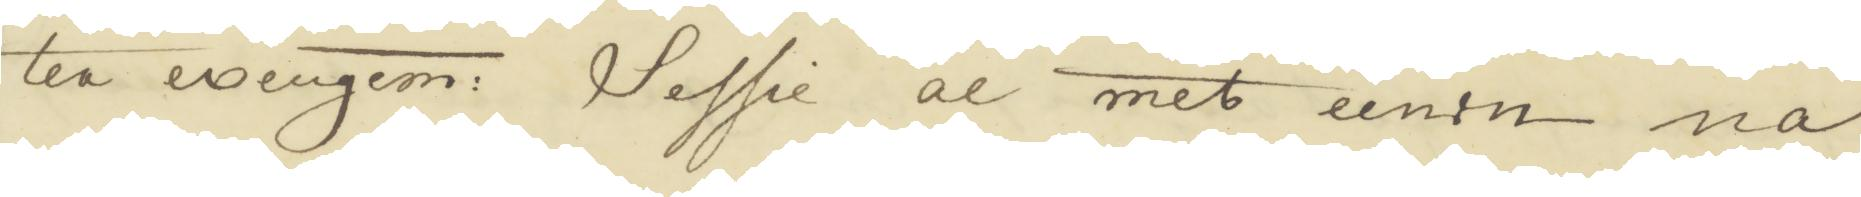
ter evengem: sessie al met eenen na
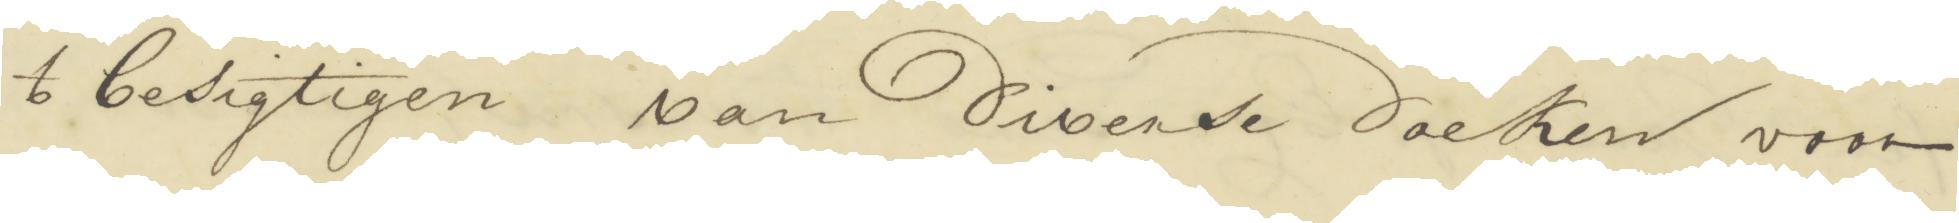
t besigtigen van diverse doeken voor
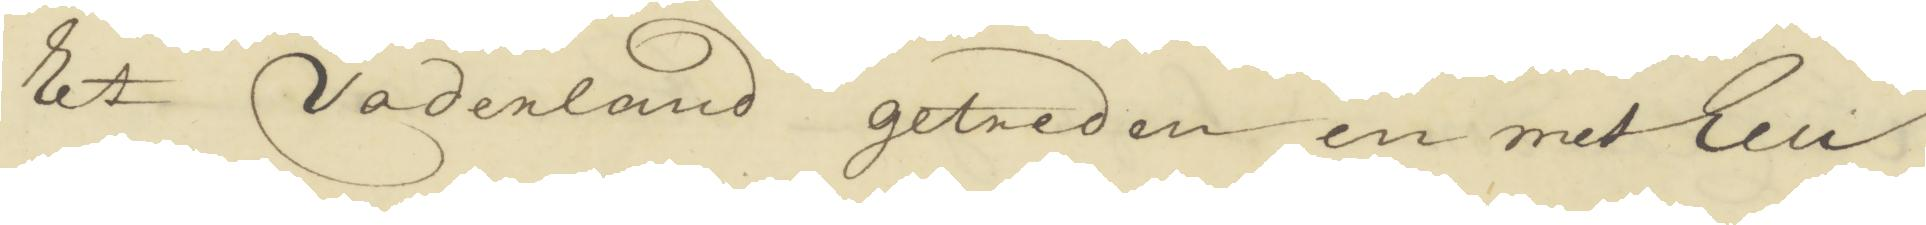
het vaderland getreden en met hen
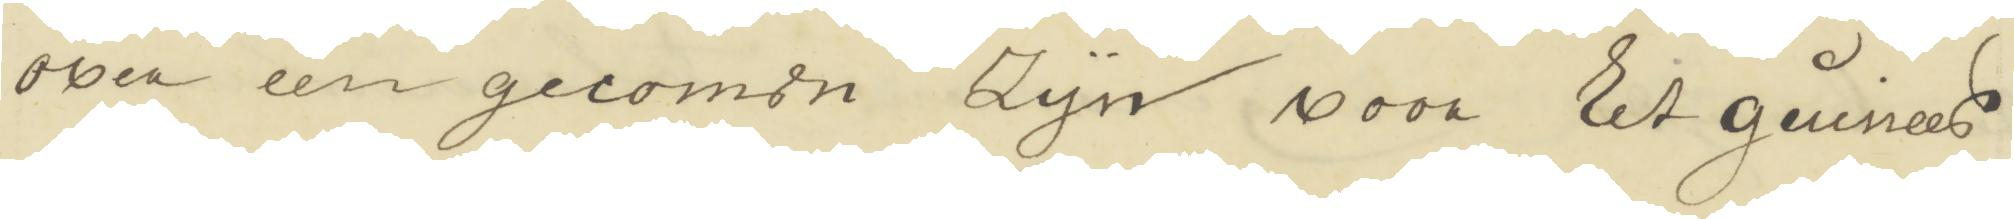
over een gecomen zijn voor het guinees
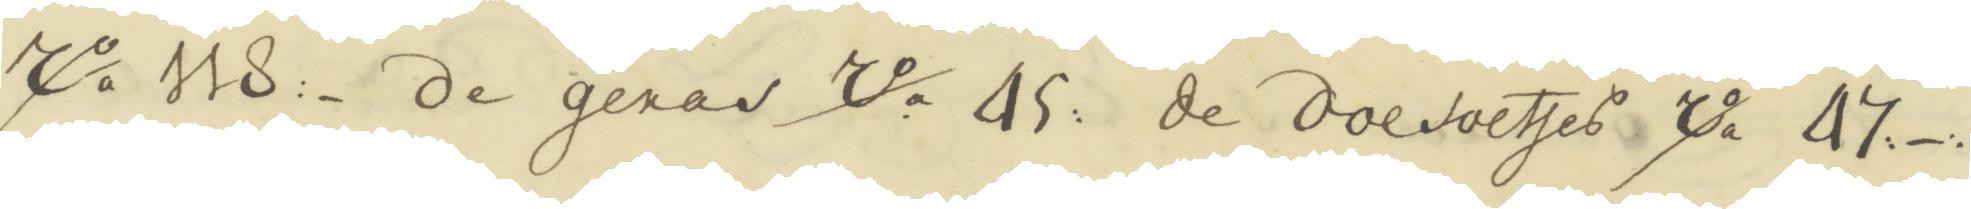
ro/a 118:- de geras ro/a 45: de doesoetjes ro/a 47:—:
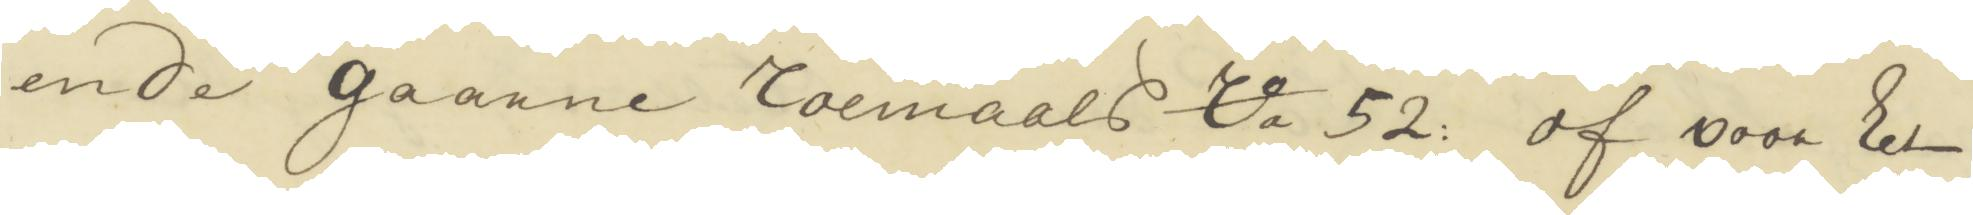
en de gaarne roemaals ro/a 52: of voor het
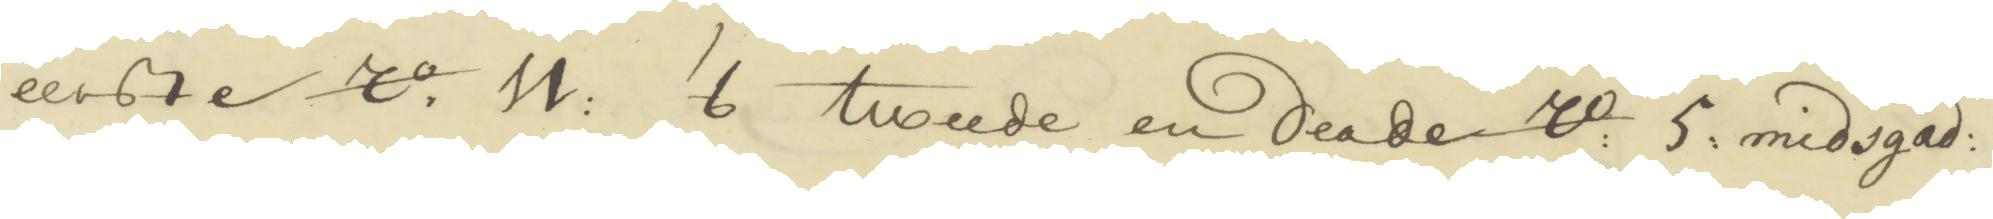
eerste ro/a 11: ’t tweede en derde ro: 5: midsgad:rs
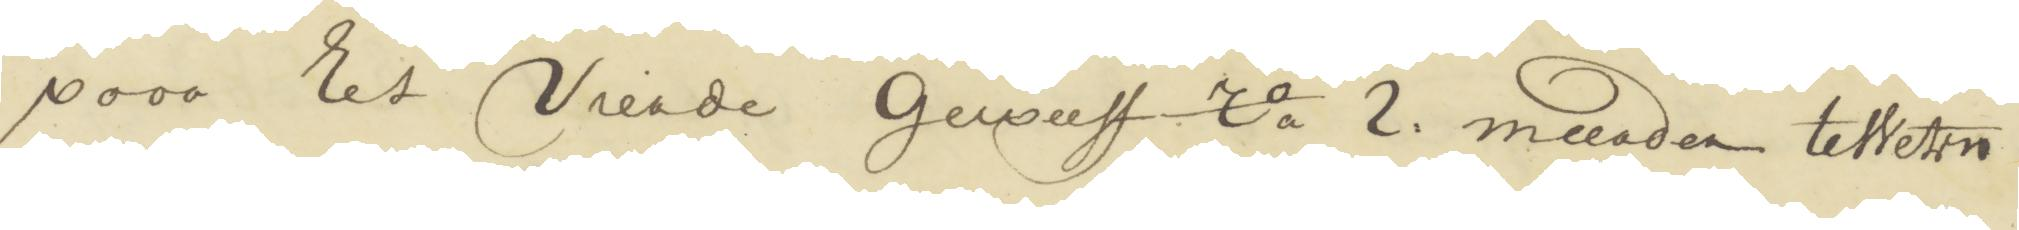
voor het vierde geweeff ro/a 2: meerder teweten
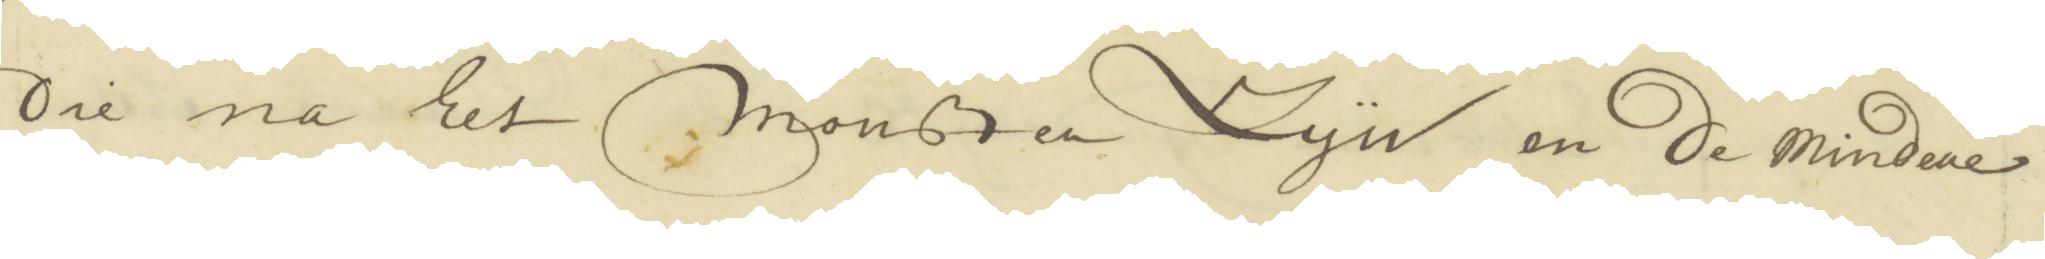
die na het monster zijn en de mindere
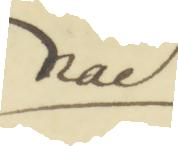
nae
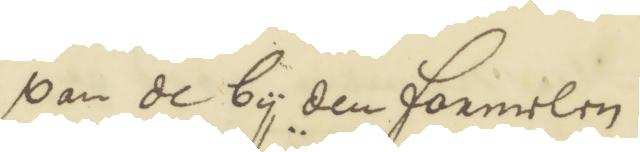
van de bij den formelen
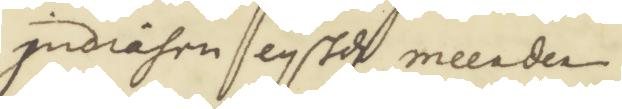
jndiasen eijsch meerder
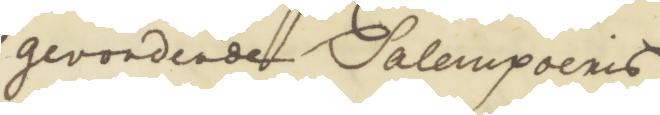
gevorderde Salempoeris
